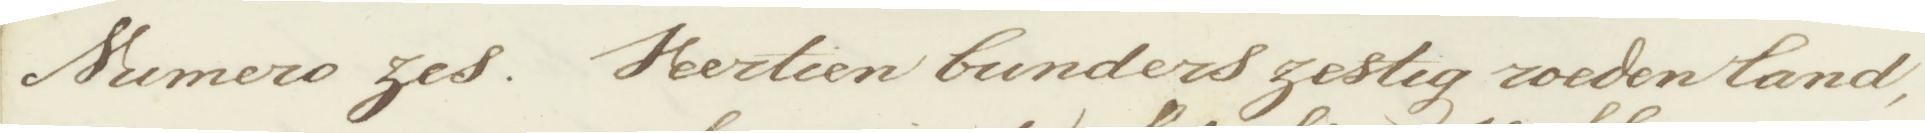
Numero zes. Veertien bunders zestig roeden land,
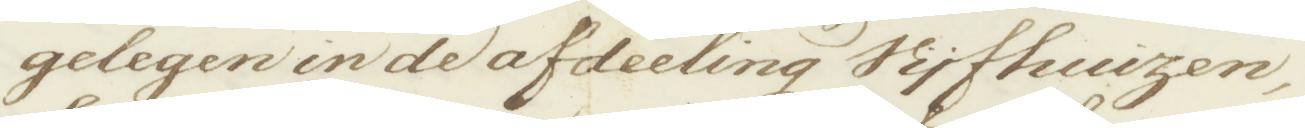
gelegen in de afdeeling Vijfhuizen,
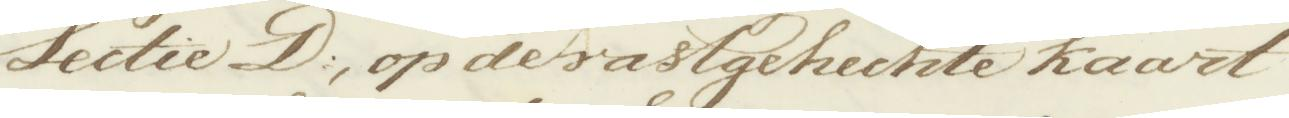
sectie D:, op de vastgehechte kaart
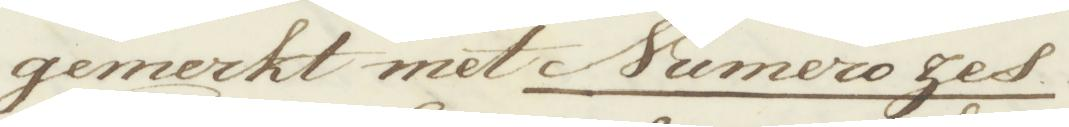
gemerkt met Numero zes.
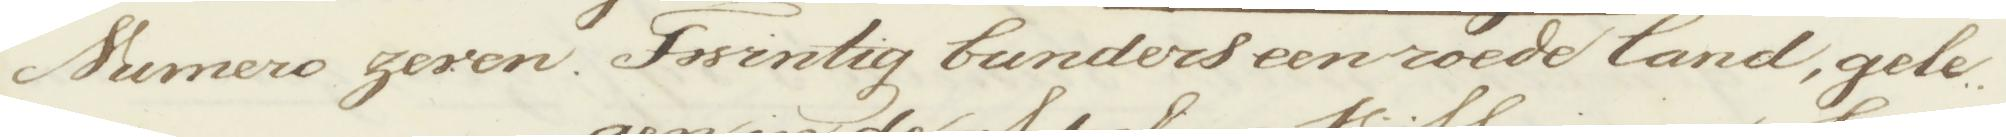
Numero zeven. Twintig bunders een roede land, gele„
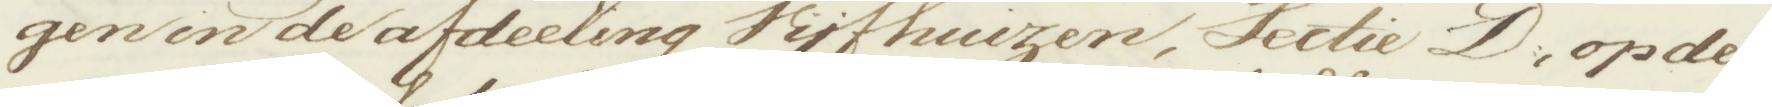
gen in de afdeeling Vijfhuizen, sectie D:, op de
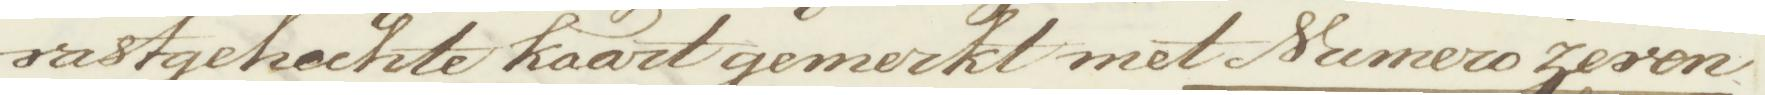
vastgehochte kaart gemerkt met Numero zeven.
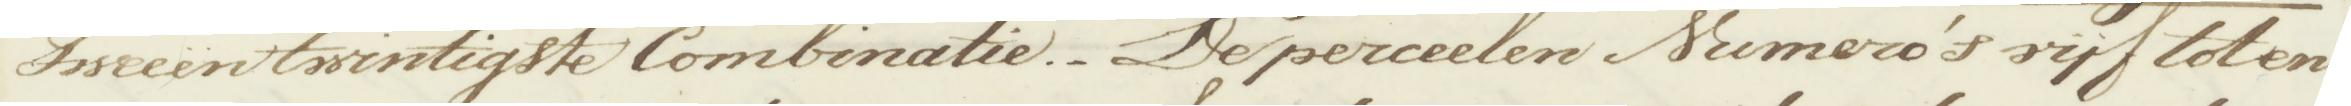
Tweeën twintigste Combinatie. - De perceelen Numero's vijf tot en
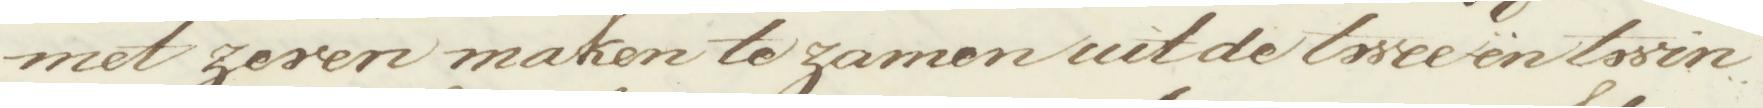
met zeven maken te zamen uit de twee ën twin„
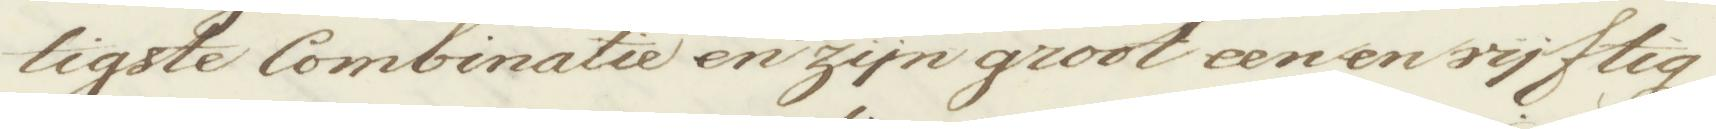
tigste Combinatie en zijn groot een en vijftig
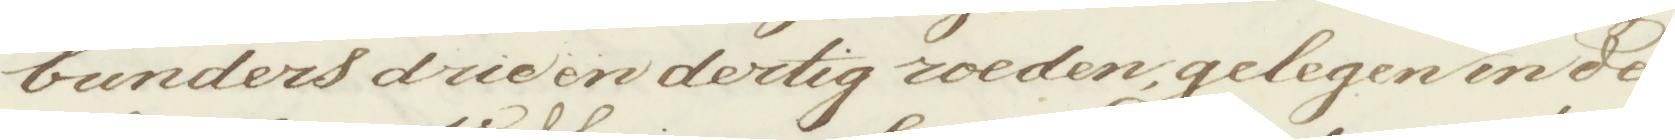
bunders drie ën dertig roeden, gelegen in de
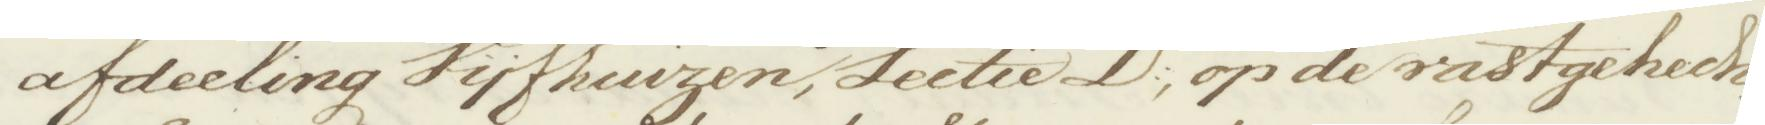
afdeeling Vijfhuizen, sectie D:, op de vastgehech
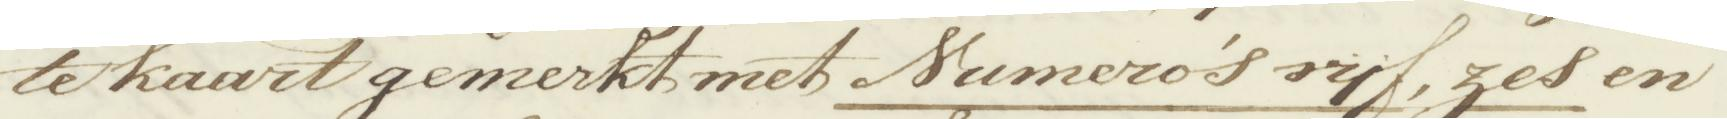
te kaart gemerkt met Numero's vijf, zes en
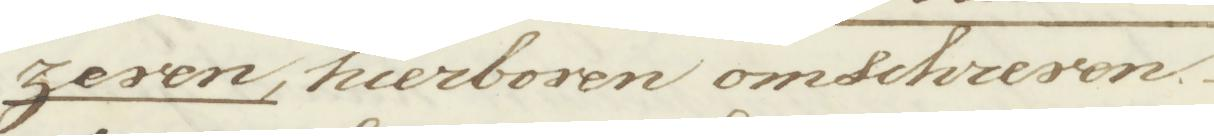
zeven, hierboven omschreven.
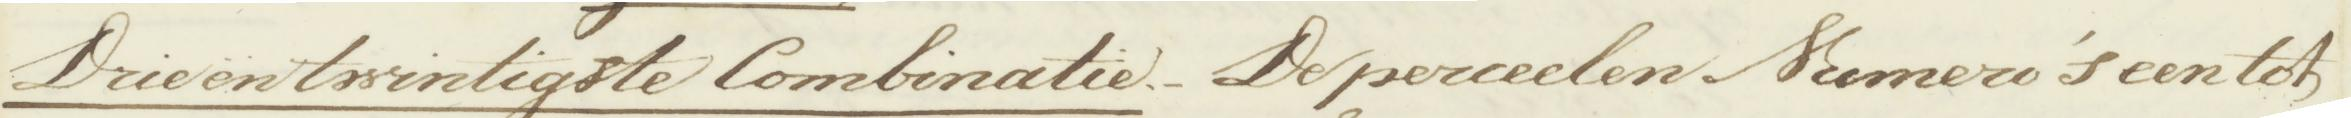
Drie ën twintigste Combinatie.- De perceelen Numero 's een tot
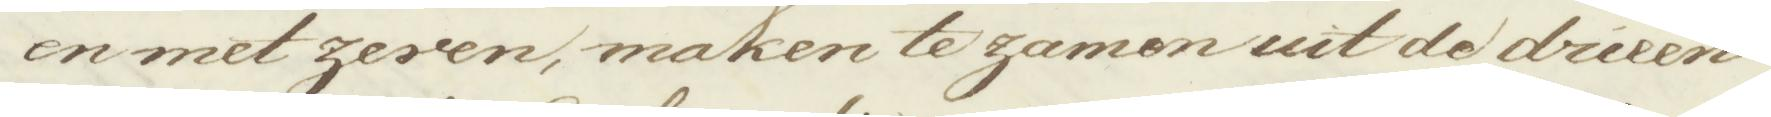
en met zeven, maken te zamen uit de drieën
